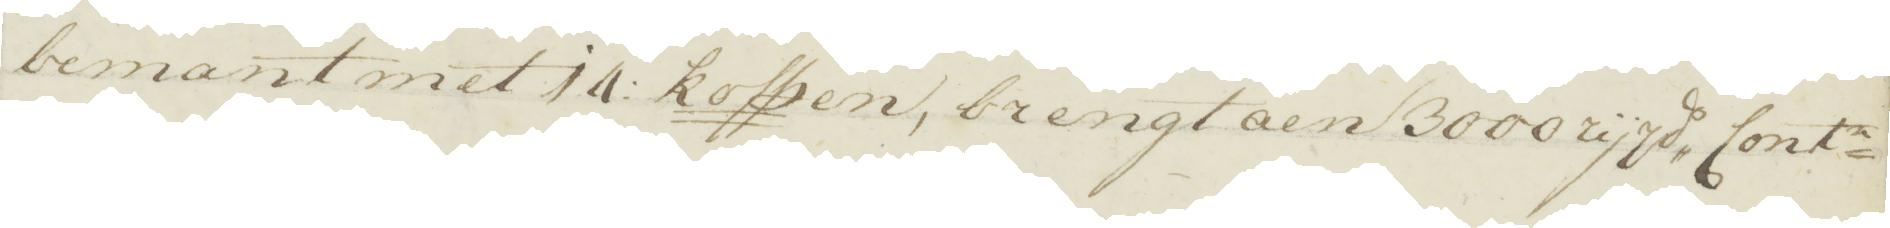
bemant met 14: koppen, brengt aen 3000 rijxd„s Cont=m
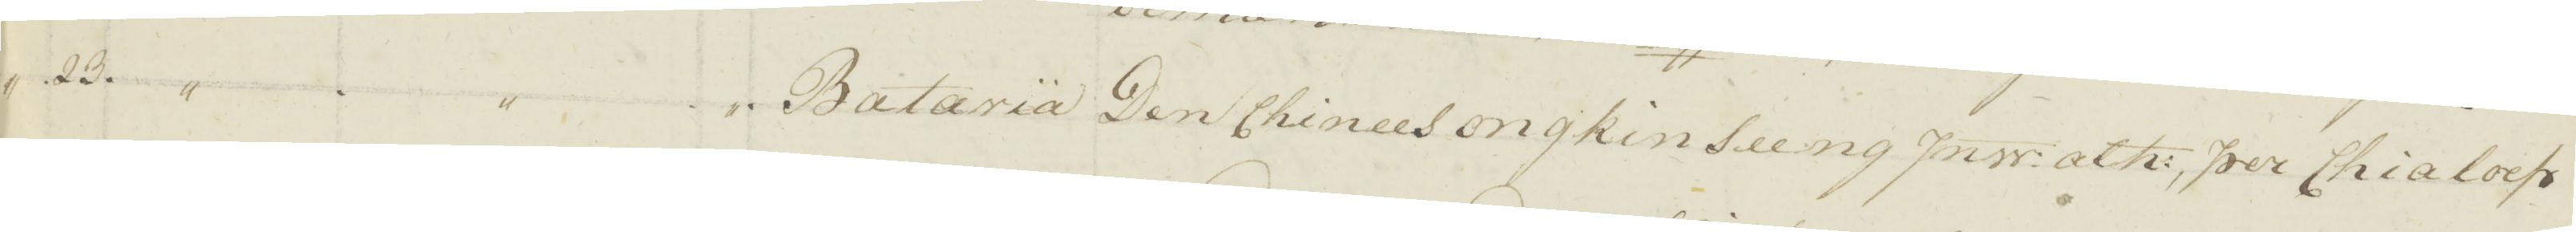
„ .23. „ . „ . „. Batavia Den Chinees ongkinseeng jnw: alh:, per Chialoep
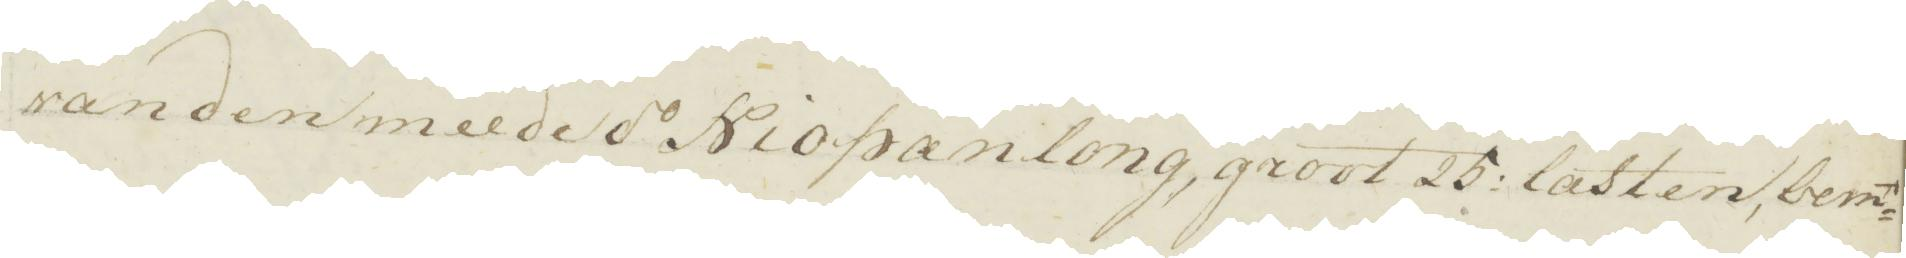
van den meede d.o Niopanlong, groot 25: lasten, bem=t
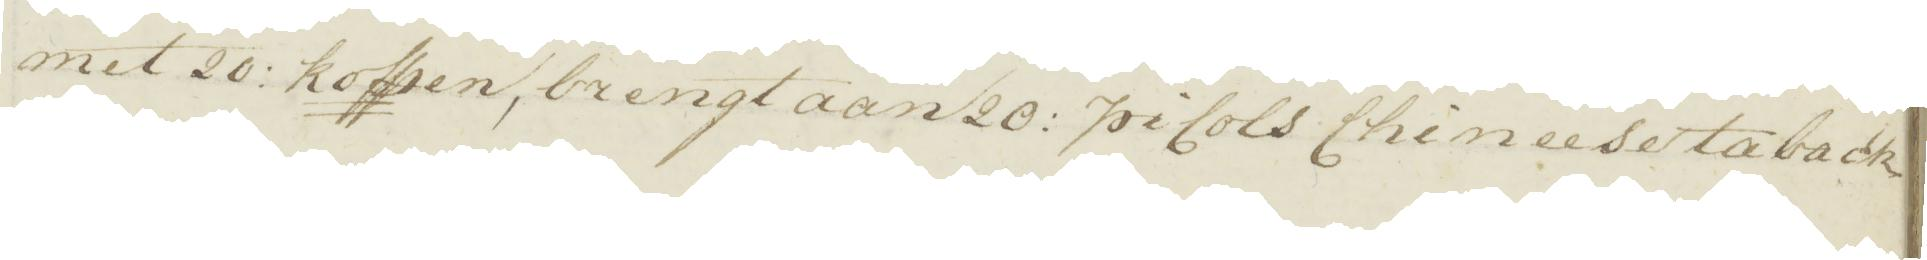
met 20: koppen, brengt aan 20: picols Chineese taback
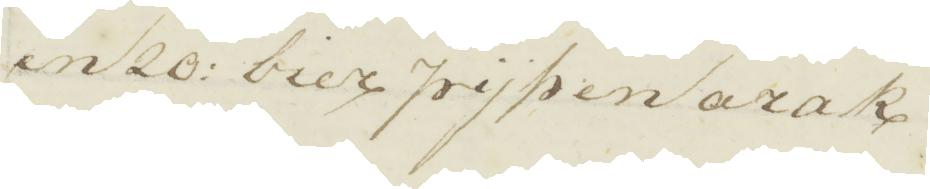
en 20: bier pijpen arak
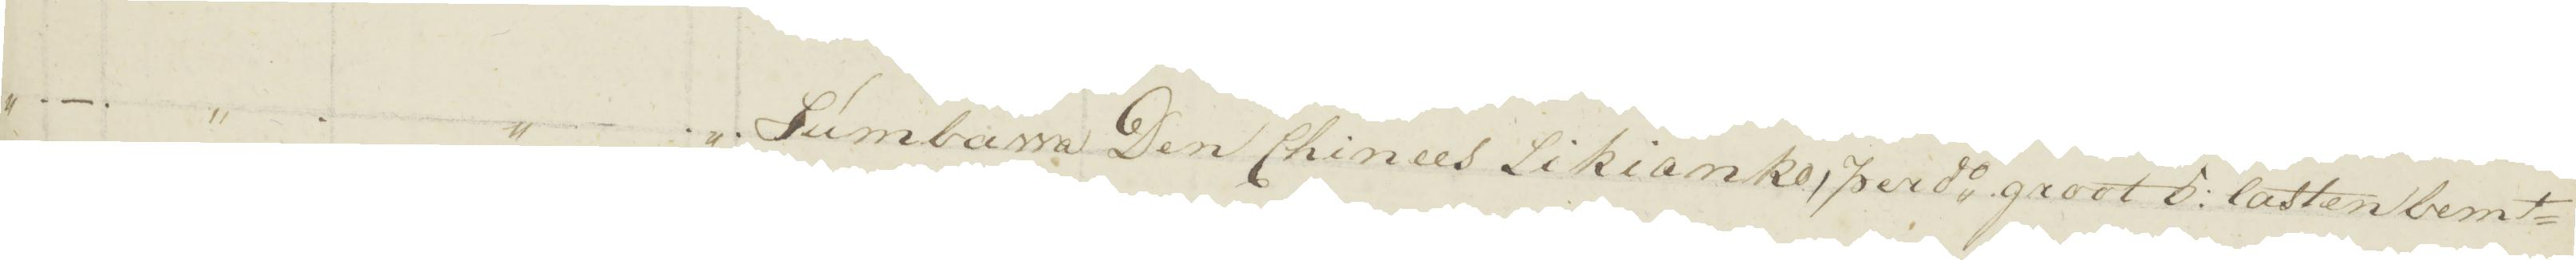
„ .—. „ . „ . „. Sumbawa Den Chinees Likianko, per d„o groot 5: lasten bem=t
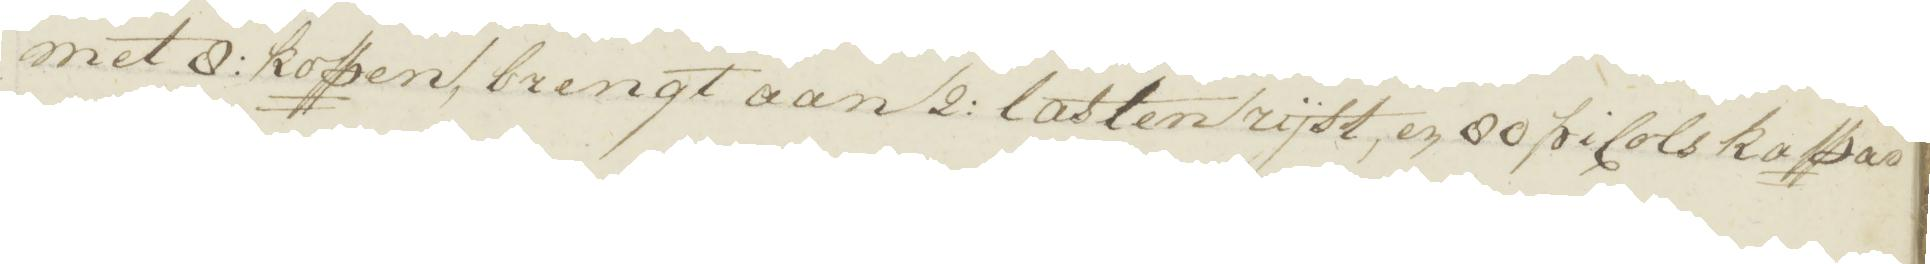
met 8: koppen, brengt aan 2: lasten rijst, en 80 picols kappas
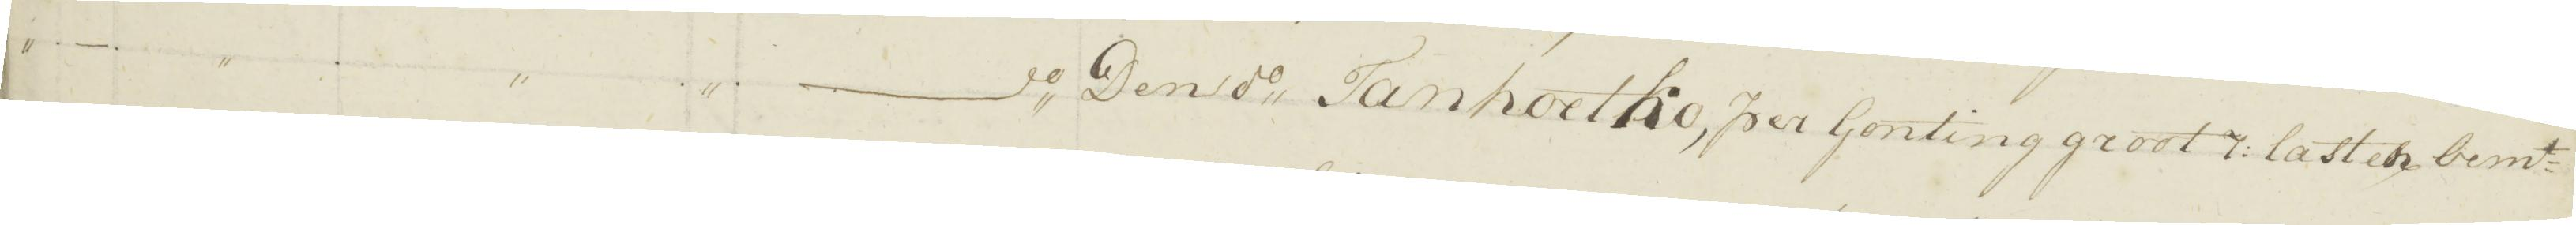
„ .—. „ . „ .„. _„o Den d„o Tanhoetko, per Gonting groot 7: lasten bem=t
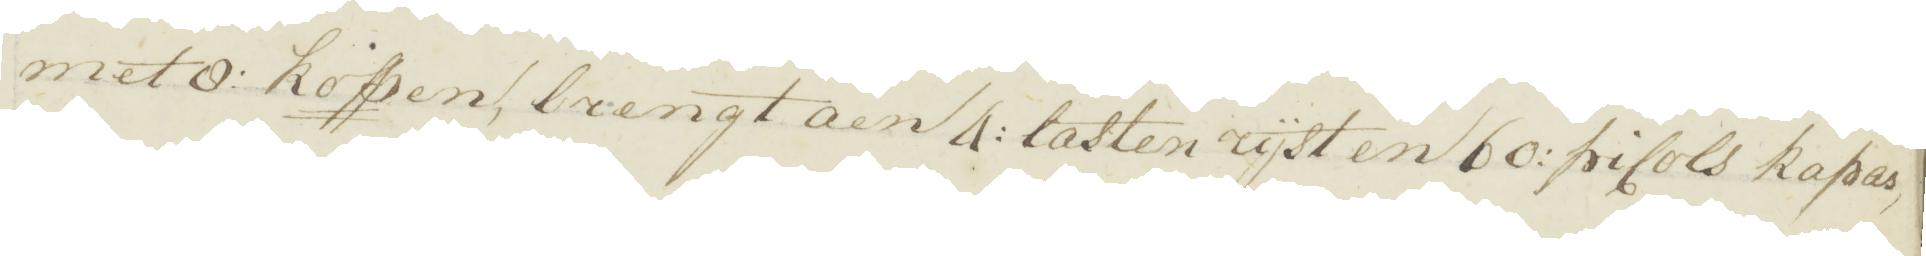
met 8: koppen, brengt aen 4: lasten rijst en 60: picols kapas,
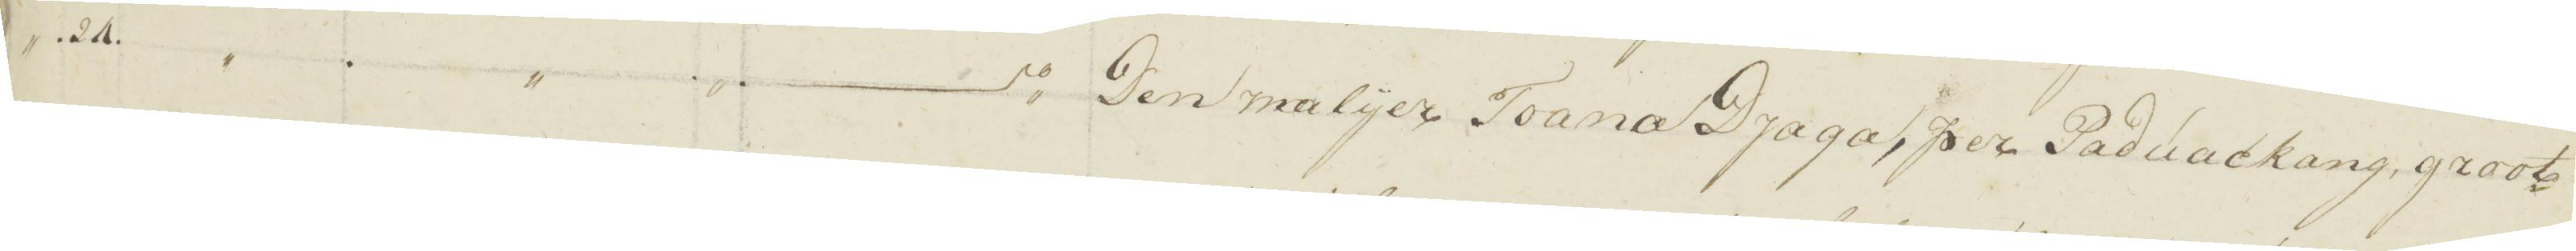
„ .24. „ . „ .„. _„o Den malijer Toana Djaga, per Paduackang, groot
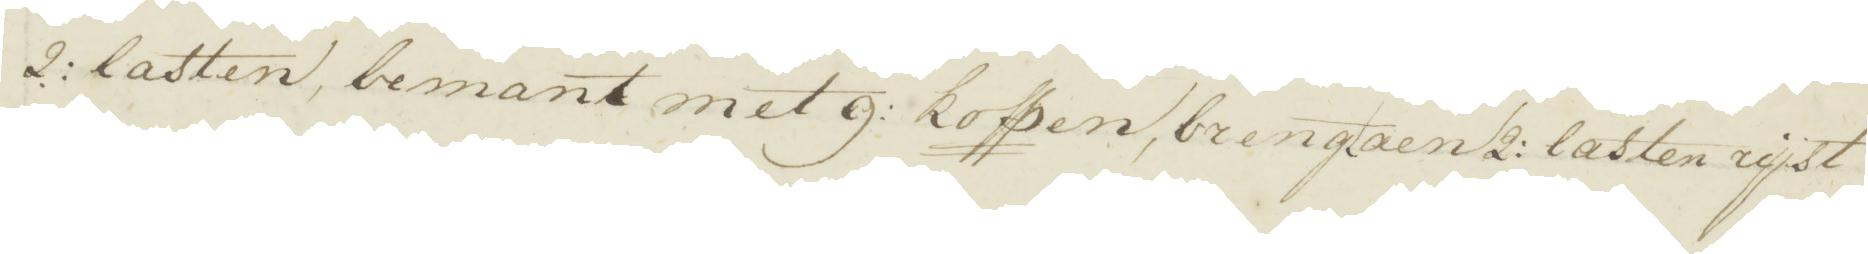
2: lasten, bemant met 9: koppen, brengt aen 2: lasten rijst
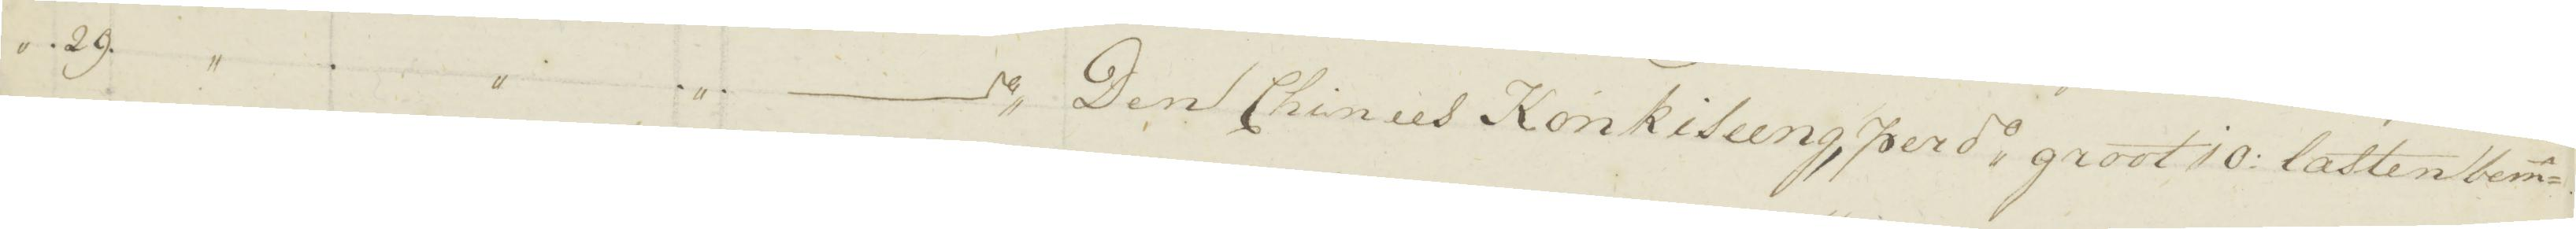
„ .29. „ . „ .„. _„o Den Chinees Konkiseeng, per d„o groot 10: lasten bem=t
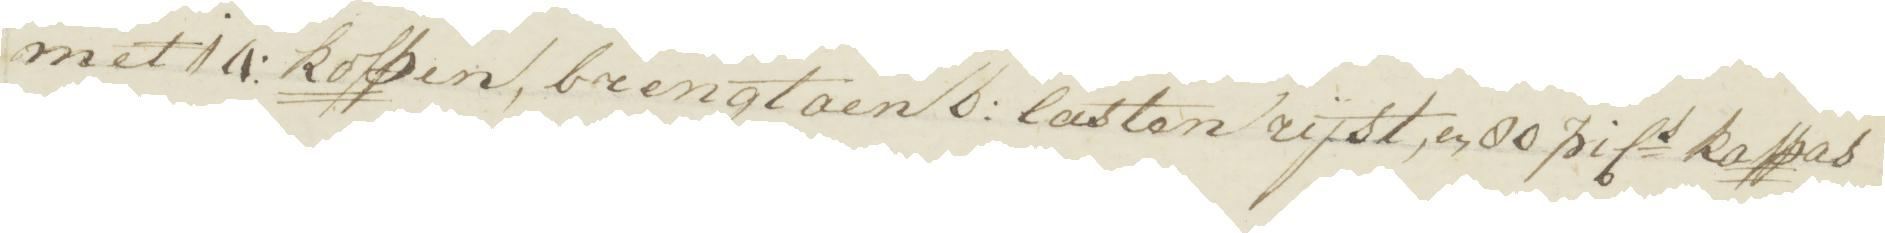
met 14: koppen, brengt aen 6: lasten rijst, en 80 pic=s kappas
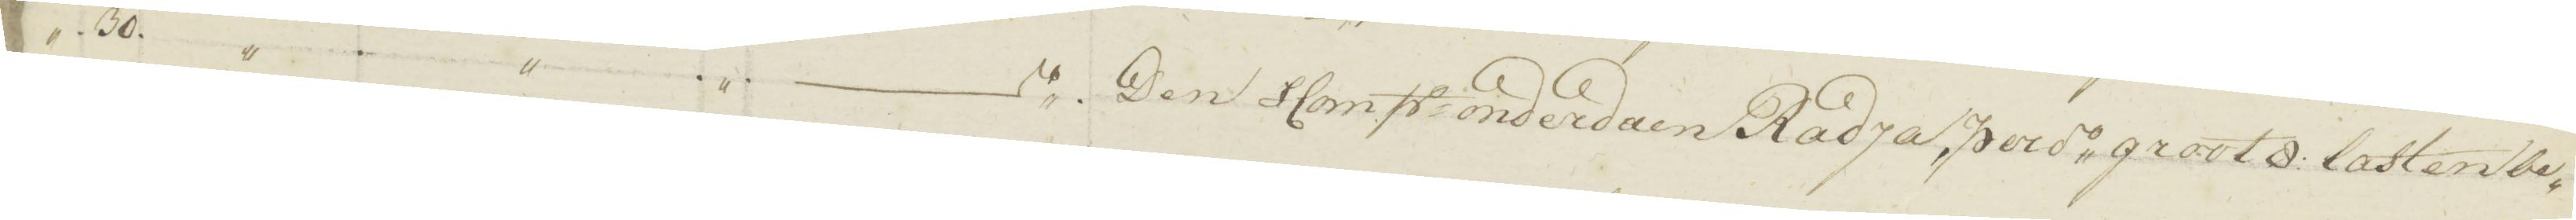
„ .30. „ . „ .„. _„o Den sComp=s onderdaen Radja, per d„o groot 8: lasten be„
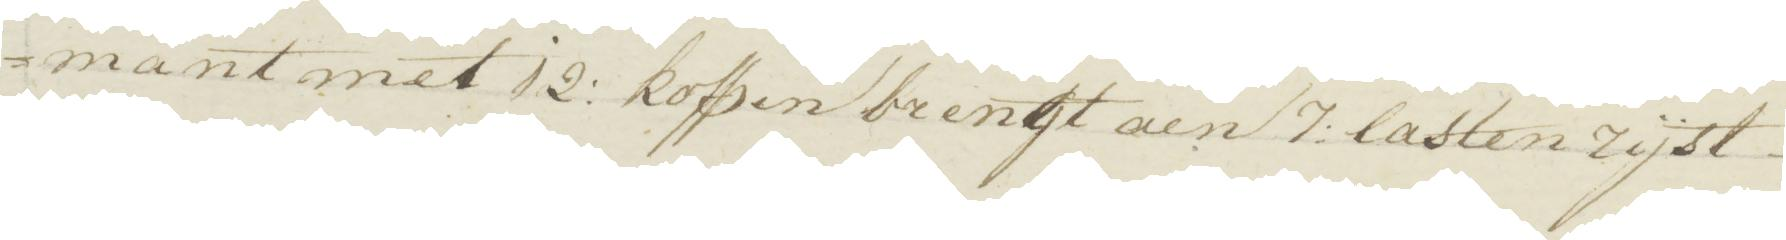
=mant met 12: koppen brengt aen 7: lasten rijst
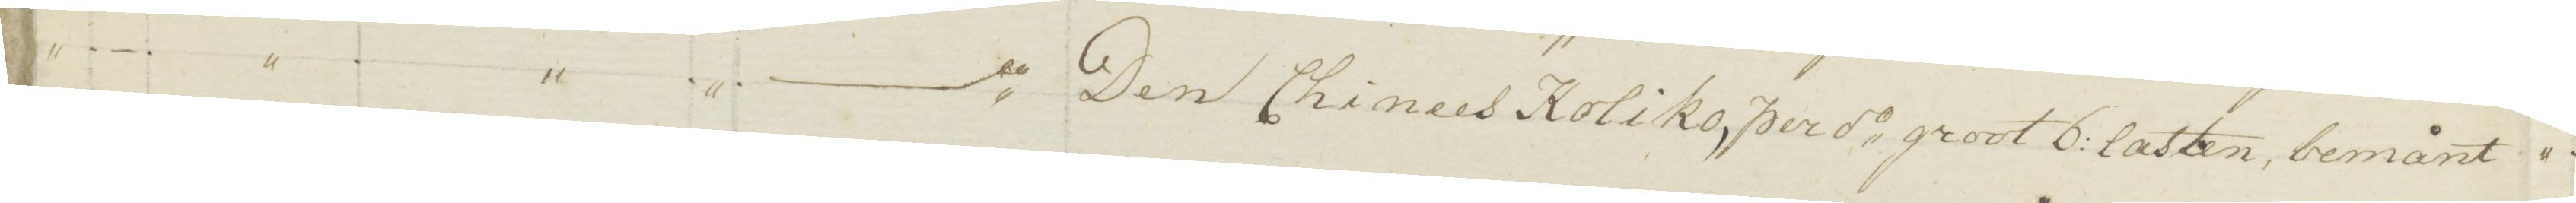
„ .—. „ . „ .„. _„o Den Chinees Koliko, per d„o groot 6: lasten, bemant
